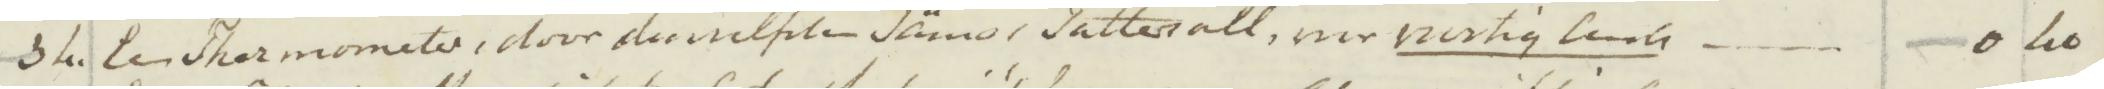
34. Een Thermometer, door denzelfden Jämes Fattervall, voor veertig Cents - - - - - — 0 40
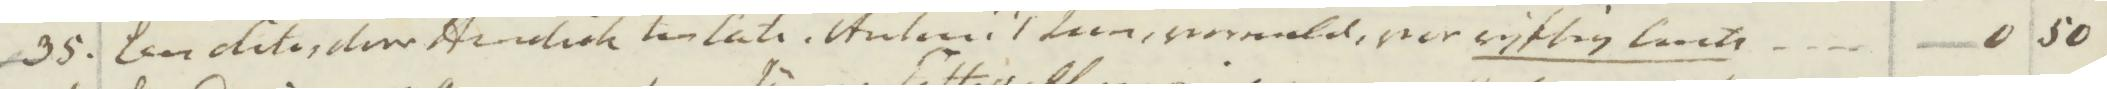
35. Een dito, door Hendrik ten Cate. Antoni 's zoon, voormeld, voor vijftig Cents - - - — 0 50
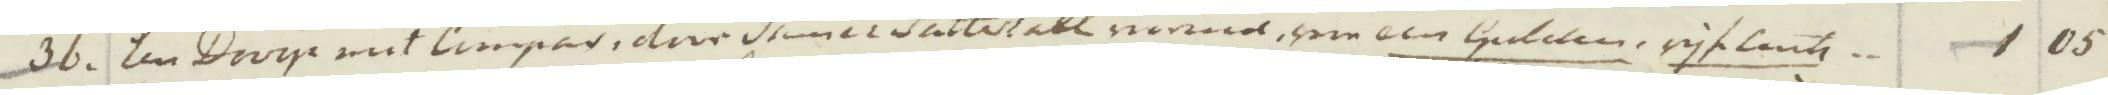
36. Een Doosje met Compas, door Jämes Fattervall voorzeid, voor een Gulden, vijf Cents - - —1 05
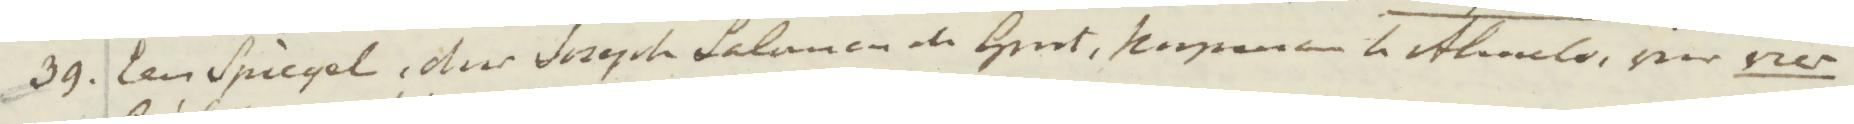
39. Een spiegel, door Joseph Salomen de Groot, Koopman te Almelo, voor vier
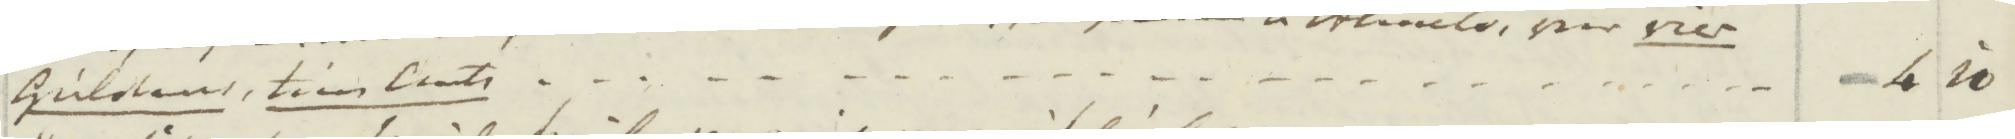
Guldens, tien Cents - - - - - - - - - - - - - - - - - - - - - - - - - - -- - - - - - - - - - - - - - - - - -- - - - - — 4 10
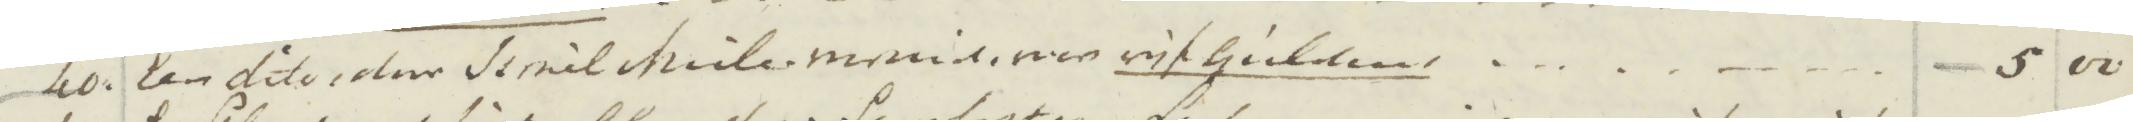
40: Een dito, door Israel Muler voorzeid, voor vijf Guldens - - - - - - - - - - - - - - - - - - - - - - - - — 5 00
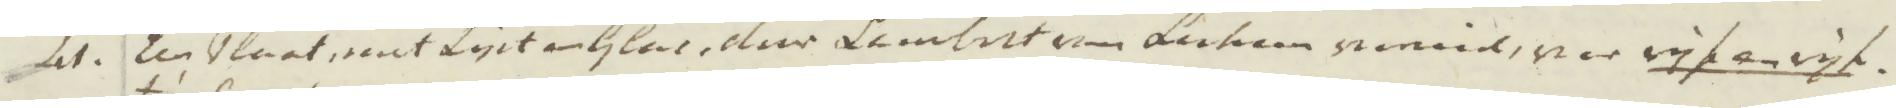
41. Een Plaat met Lijst en Glas, door Lambert van Lutum voorzeid, voor vijf en vijf-
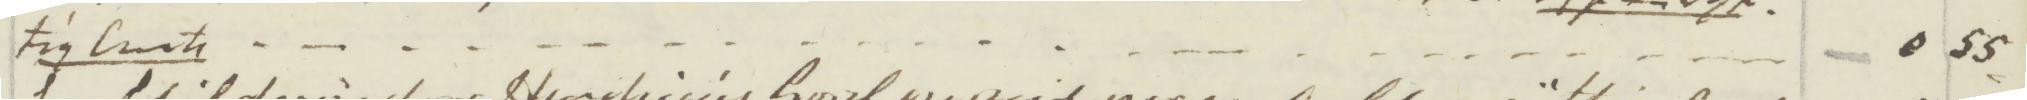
tig Cents - - - - - - - - - - - - - - - - - - - - - - - - - - - - - - - - - - - - - - - - - - - - - - - - - - - - - - - — 0 55
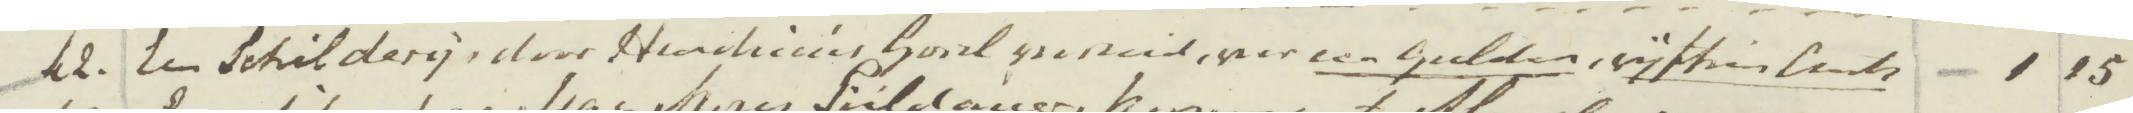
42. Een schilderij, door Hendricus Gorel voorzeid, voor een Gulden vijftien Cents —1 15
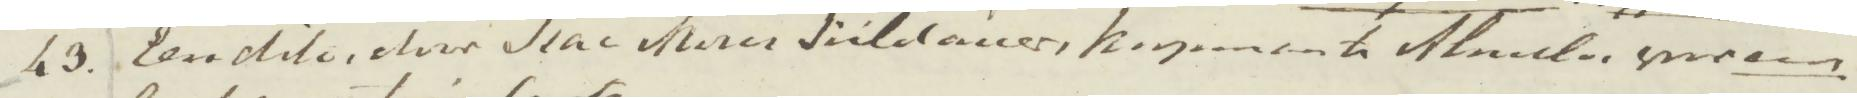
43. Een dito, door Isac Mozes Fuldauer Koopman te Almelo, voor een
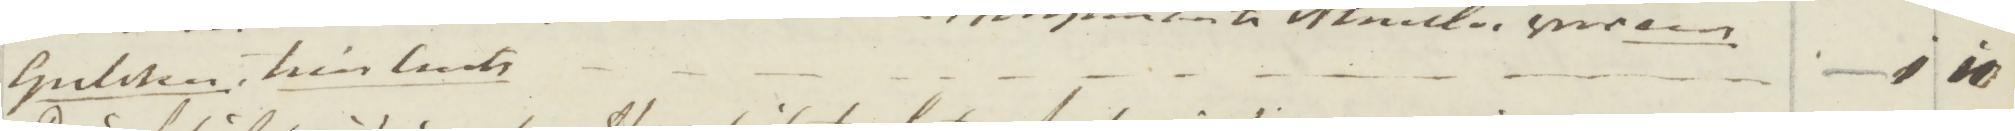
Gulden, tien Cents - - - - - - - - - - - - - - - - - - - - - - - - - - - - - - - - - - - - - - - — 1 10
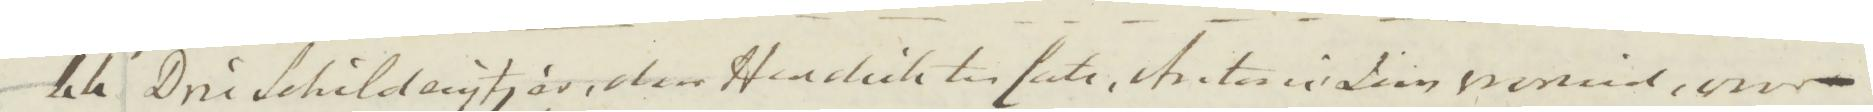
44 Drie schilderijtjes, door Hendrik ten Cate, Antoni's zoon voorzeid, voor
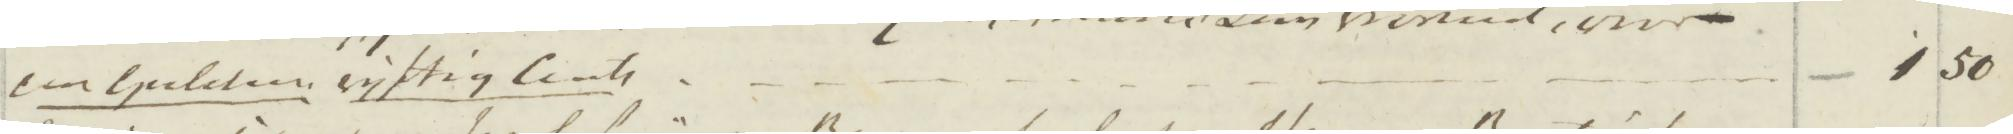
een Guldens vijftig Cents - - - - - - - - - - - - - - - - - - - - - - - - - - - - - - - - - - - — 1 50
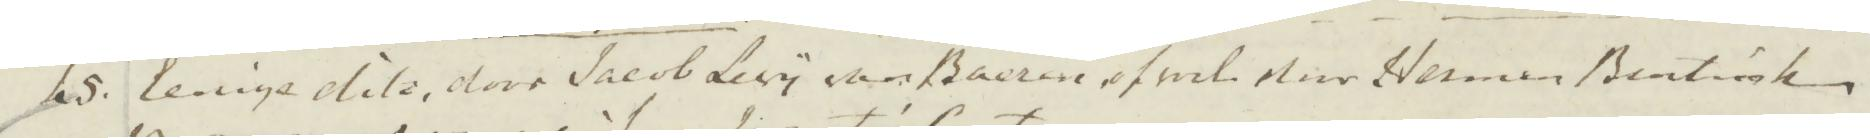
45. Eenige dito, door Jacob Levij van Baeren, of wel door Herman Bentink
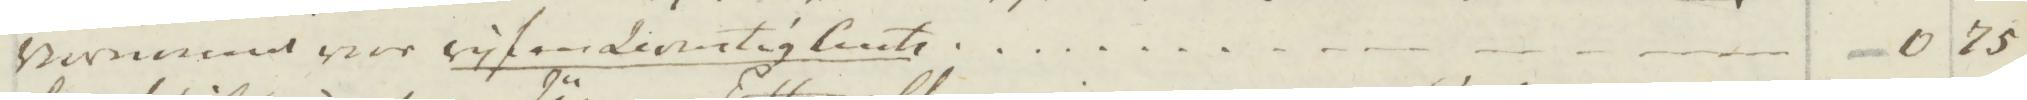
Voornoemd voor vijf en Zeventig Cents - - - - - - - - - - - - - - - - - - - - - - - - - — 0 75
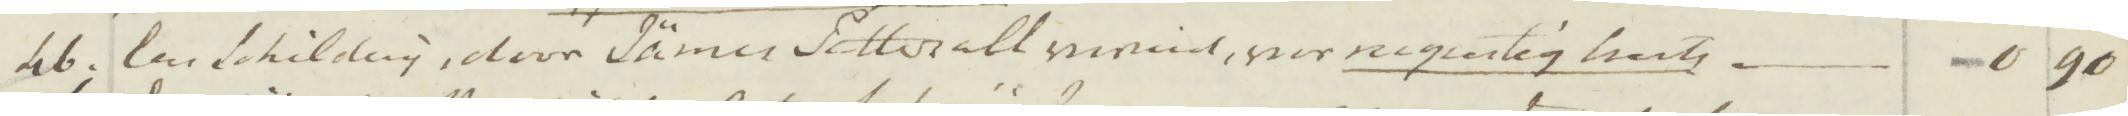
46. Een schilderij, door Jämes Fattervall voorzeid, voor negentig Cents- - - —0 90
